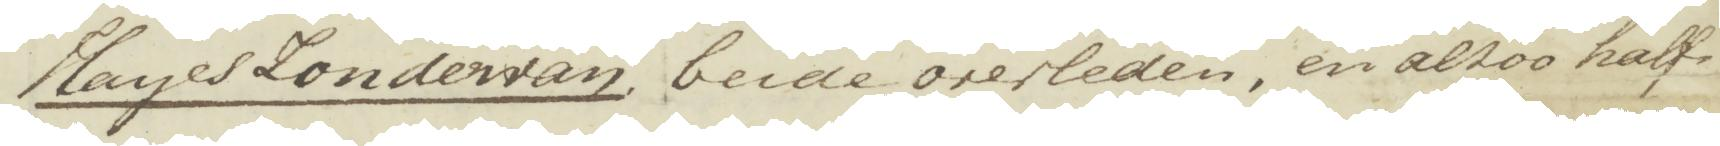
Hayes Zondervan, beide overleden, en alzoo half
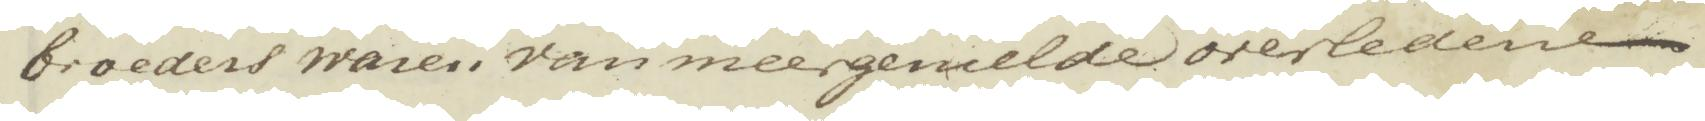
broeders waren van meergemelde overledene
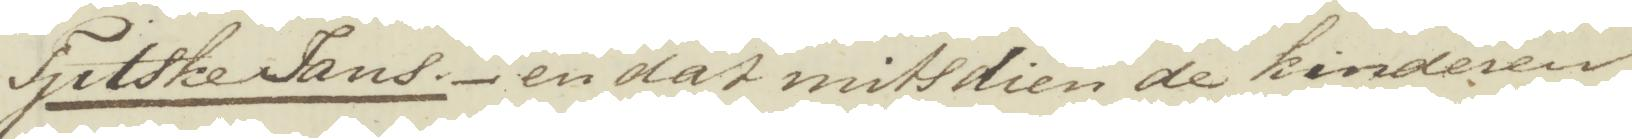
Tjitske Ians. — en dat mitsdien de kinderen
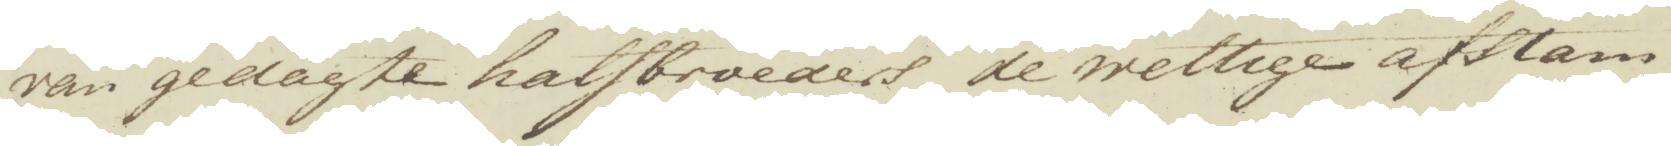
van gedagte halfbroeders de wettige afstam
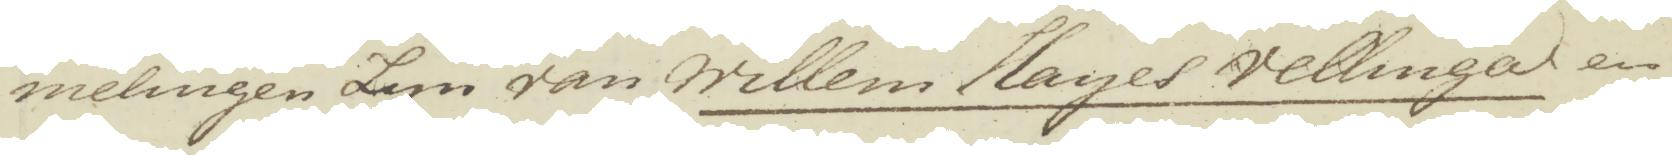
melingen zyn van Willem Haijes Vellinga en
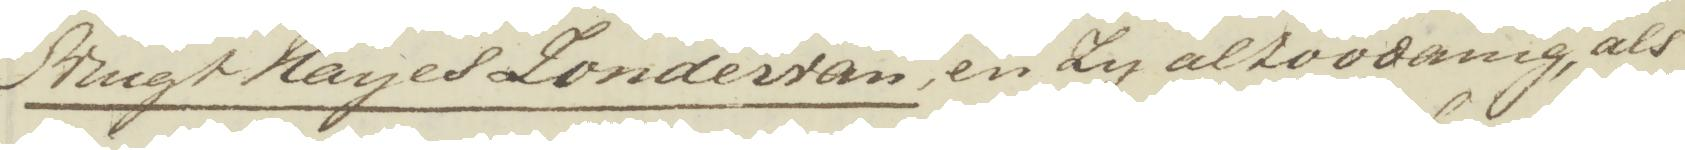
Brugt Hayes Zondervan, en zy alzoodanig, als
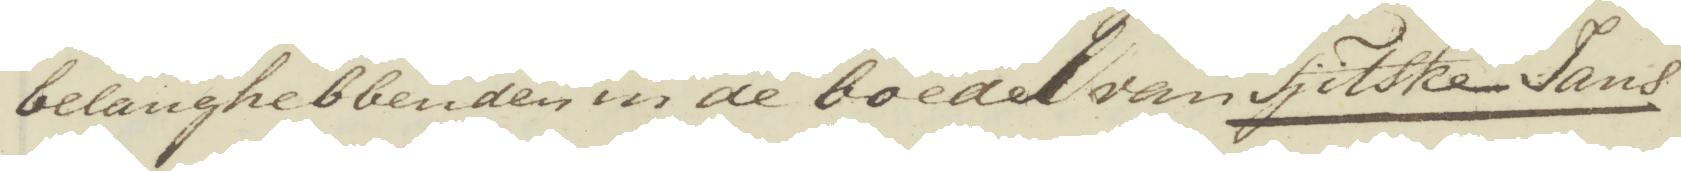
belanghebbenden in de boedel van Tjitske Ians
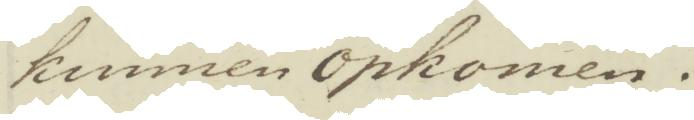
kunnen opkomen.
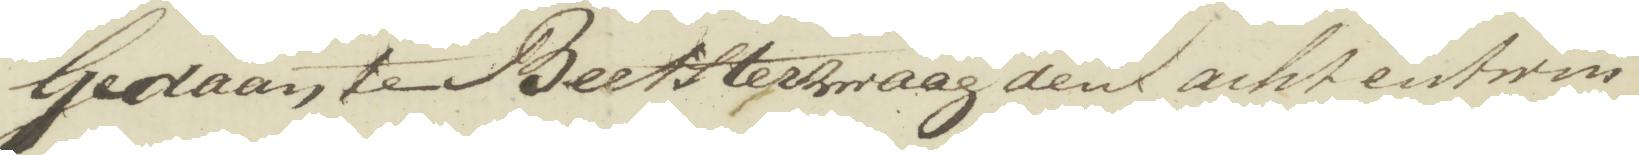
Gedaan te Beetsterzwaag den acht entwin
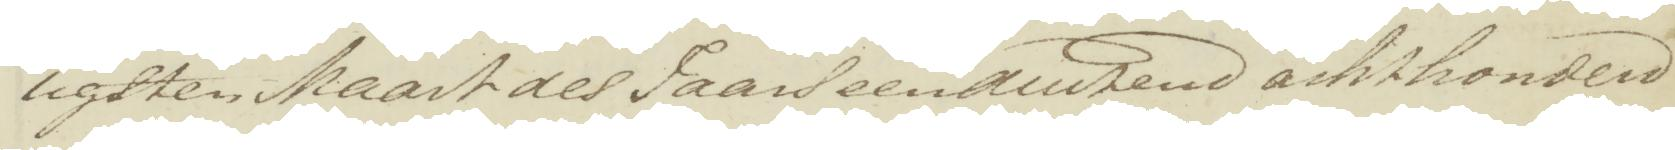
tigsten Maart des Iaars eenduizend achthonderd
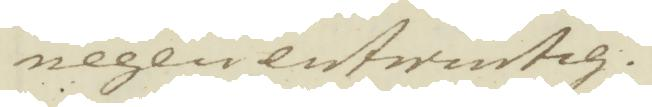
negen entwintig.
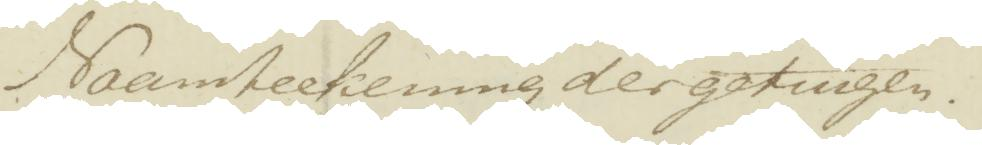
Naamteekening der getuigen.
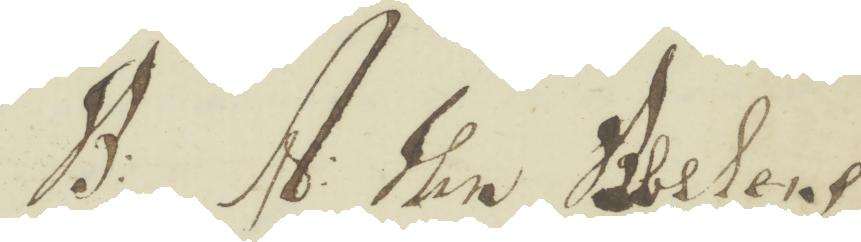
B: A: Van Boelens
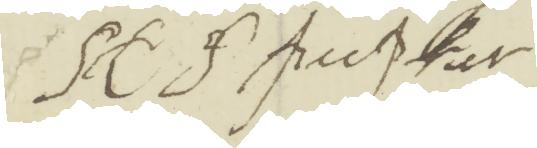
H I Piepker
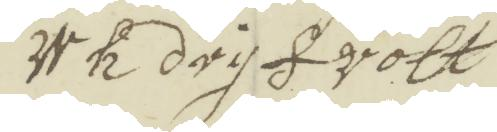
W h drijfvolt
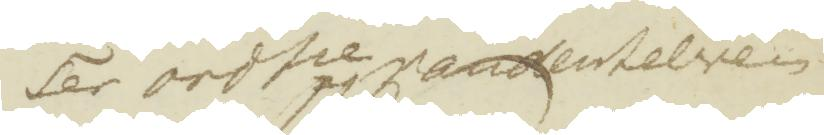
ter ordt„ie van denzelven
